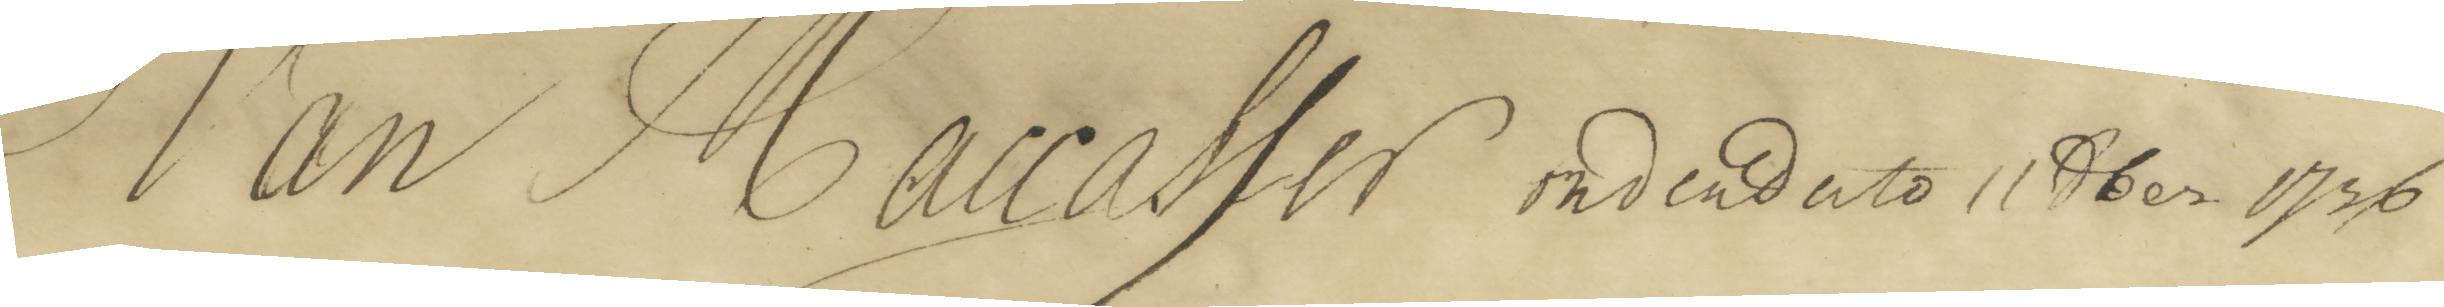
Van Maccasser onder dato 11 8ber 1736
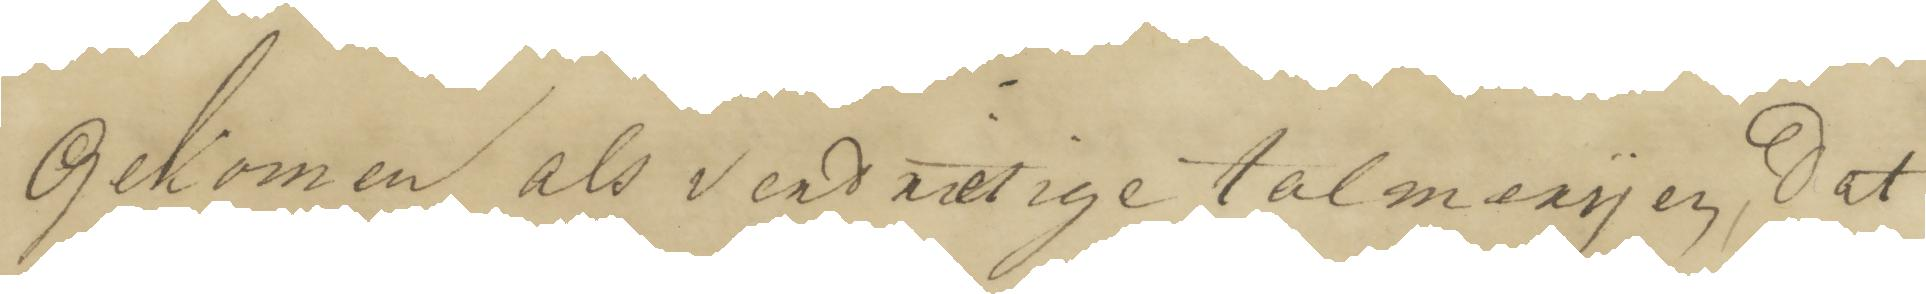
gekomen als verdrietige talmerijen, dat
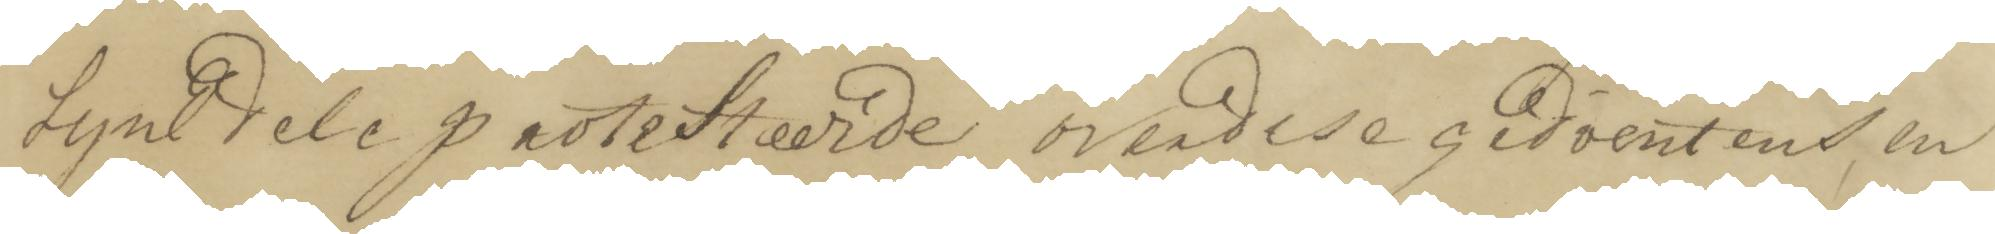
syn Edele protesteerde over dese gedoentens, en
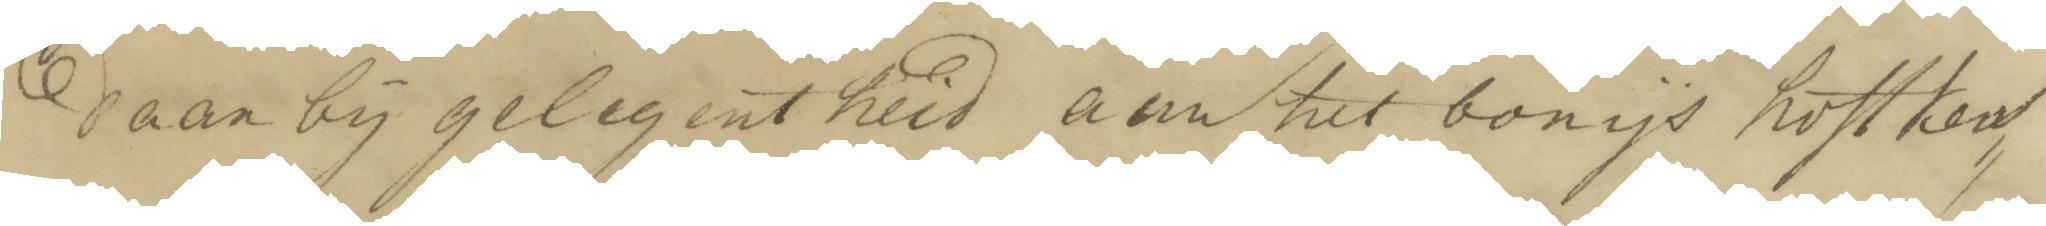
daar bij gelegentheid aan het bonijs hoff ken„
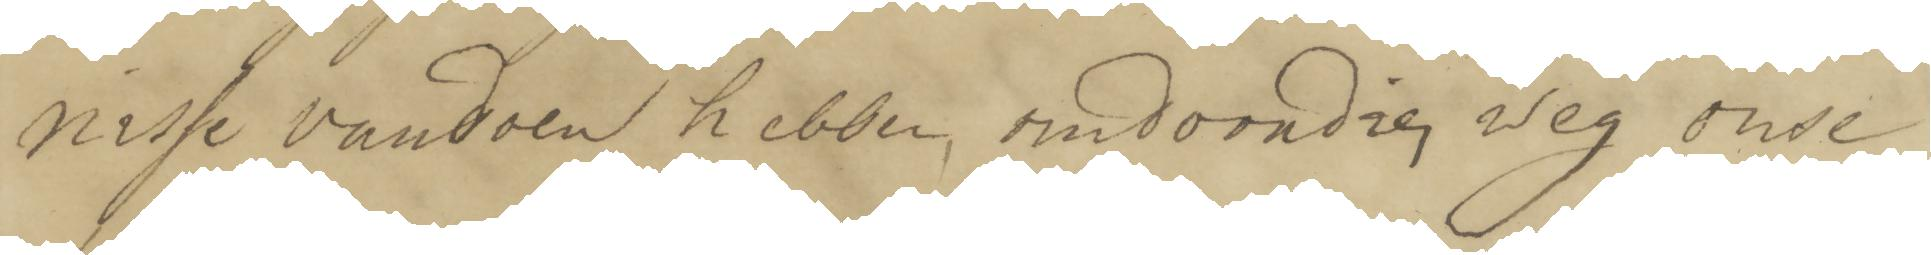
nisse van doen hebben om door dien weg onse
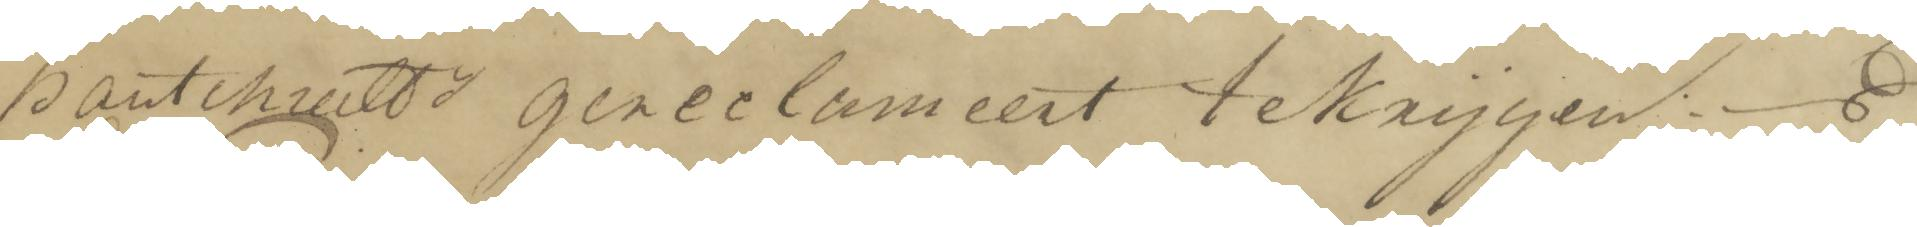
pantchialts gereclameert te krijgen: —
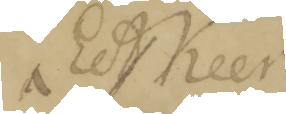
^ het keer
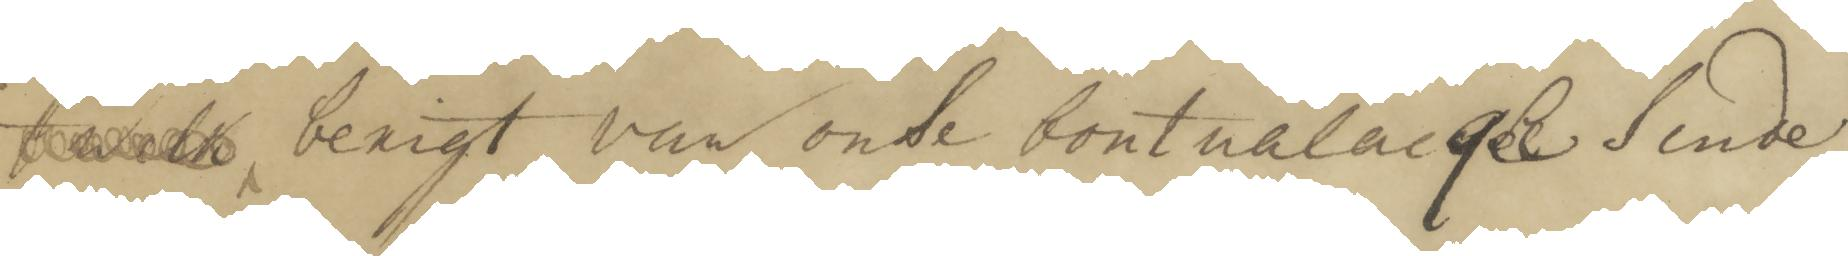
t welk^ berigt van onse bontnalacqse sende
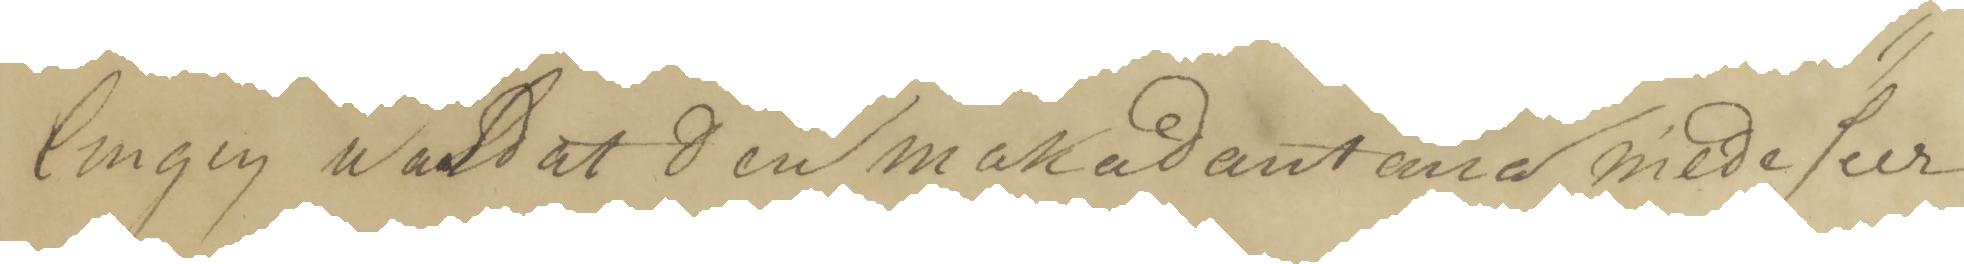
lingen was dat den makadantana mede seer
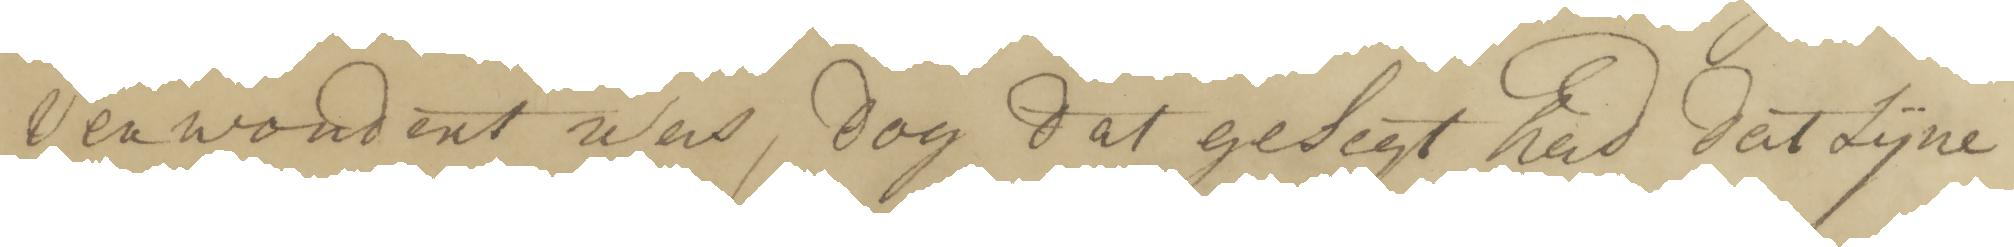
verwondert was, dog dat gesegt had dat zijne
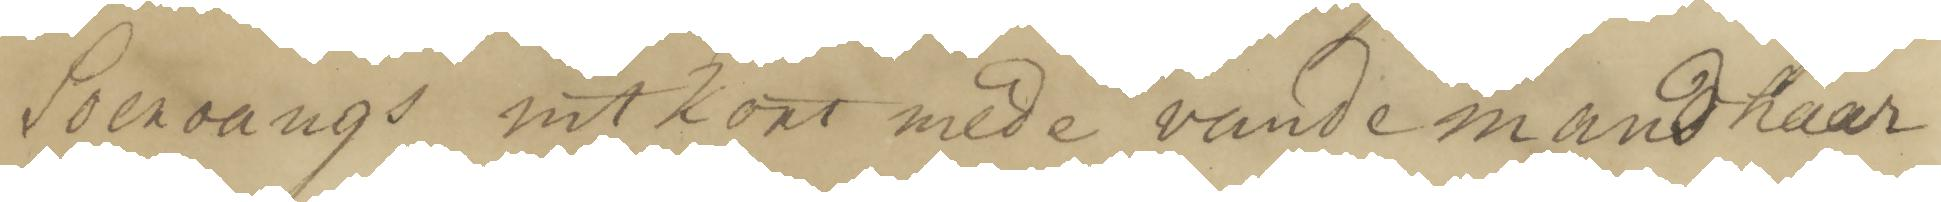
soeroangs in't kort mede vande mandhaar
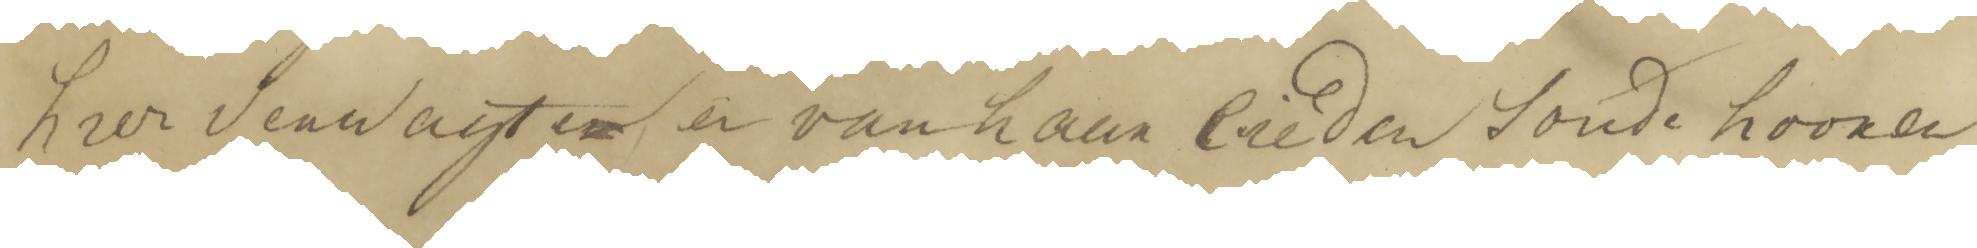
hier verwagten, en van haar lieden soude hooren
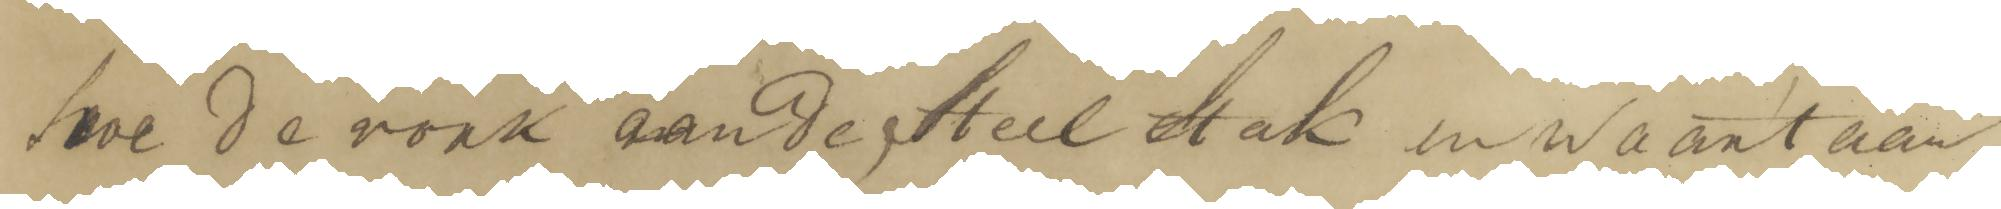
hoe de vork aan de steel stak en waar't aan
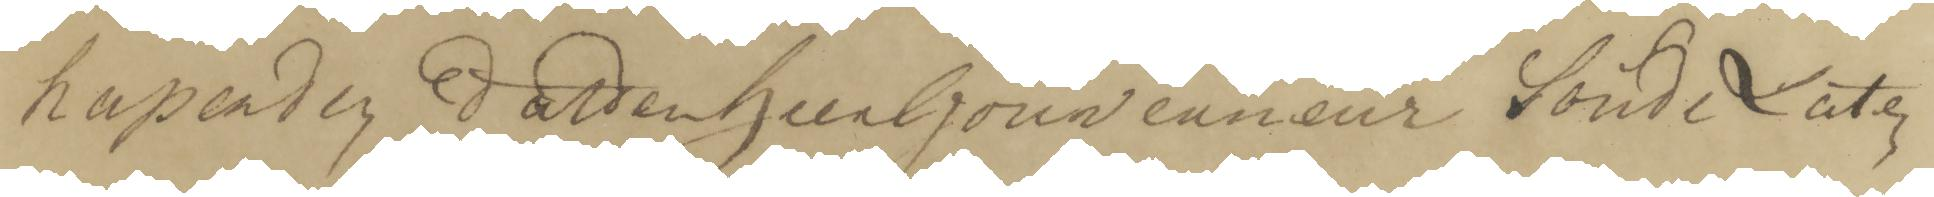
haperden dat den heer Gouverneur soude Laten
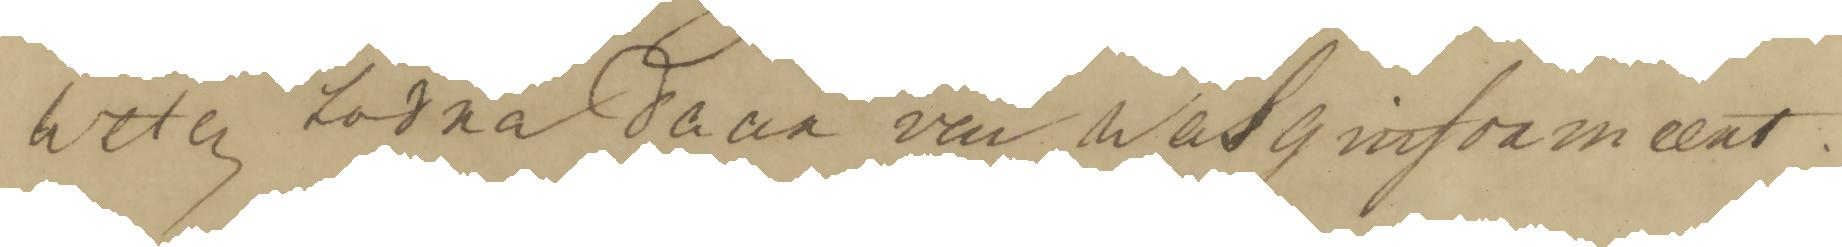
weten zodra daar van was g informeert.
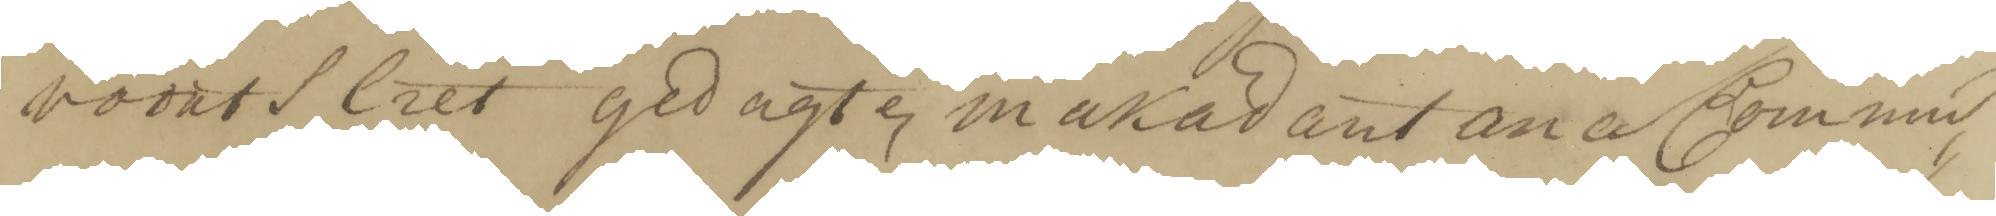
voorts liet gedagten makadantana Commu„
